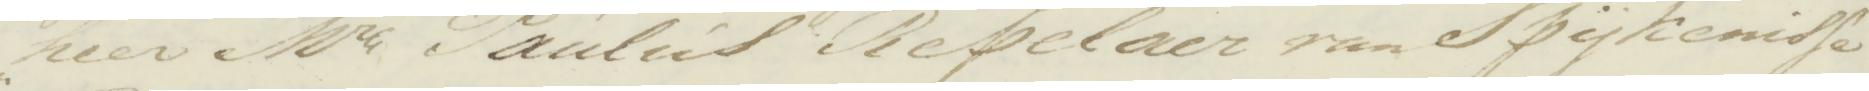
heer M„r Paulus Repelaer van Spijkenisse
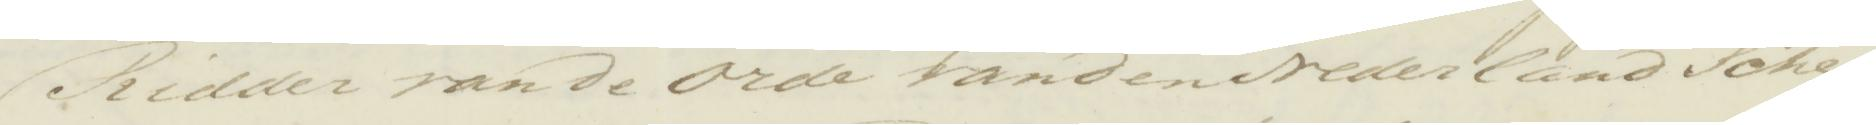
Ridder van de orde van den Nederlandsche
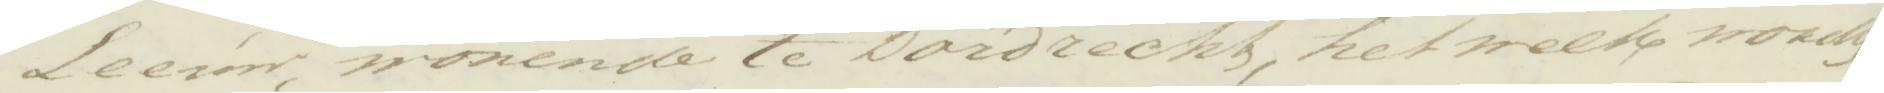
Leeuw, wonende te Dordrecht, het welk worde
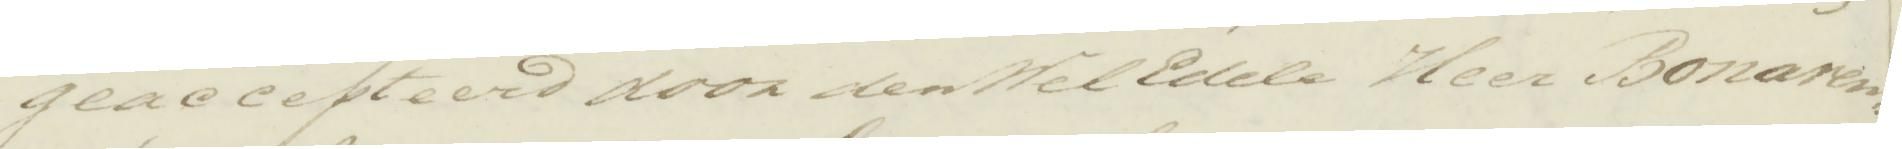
geaccepteerd door den WelEdele Heer Bonaven„
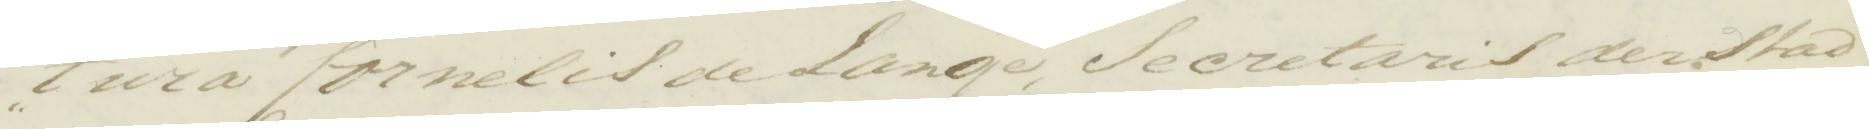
tura Cornelis de Lange, secretaris der stad
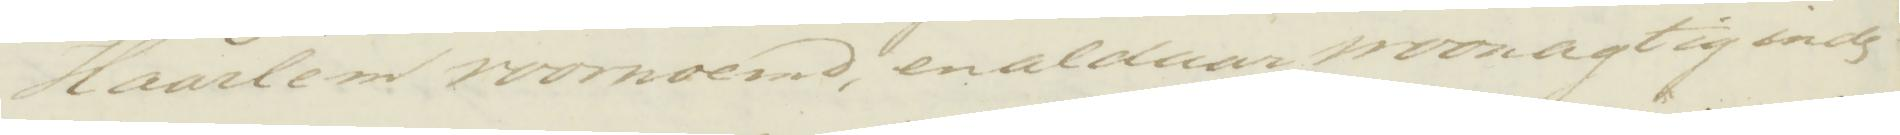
Haarlem voornoemd, en aldaar woonagtig in de
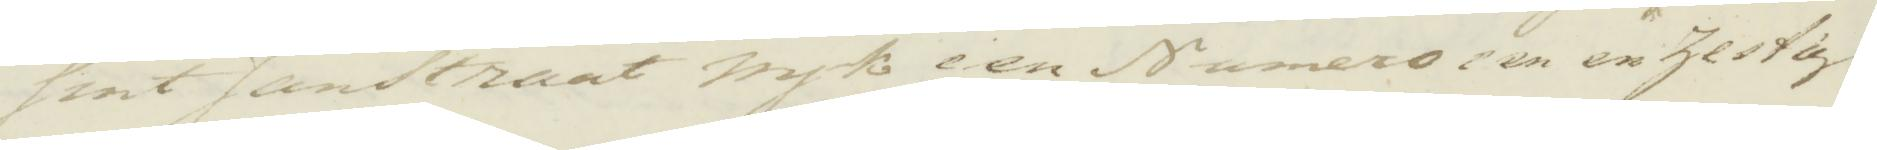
sint Jan straat wyk een Numero een en Zestig
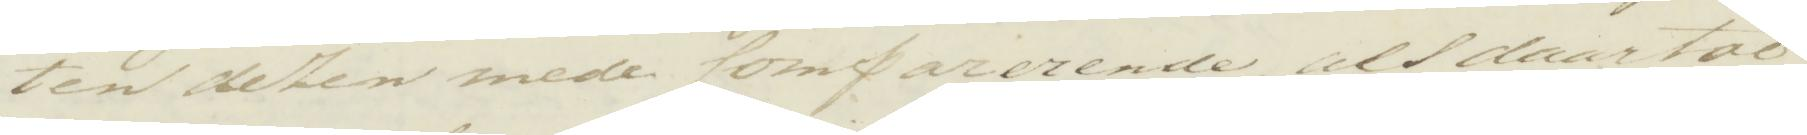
ten dezen mede Comparerende, als daar toe
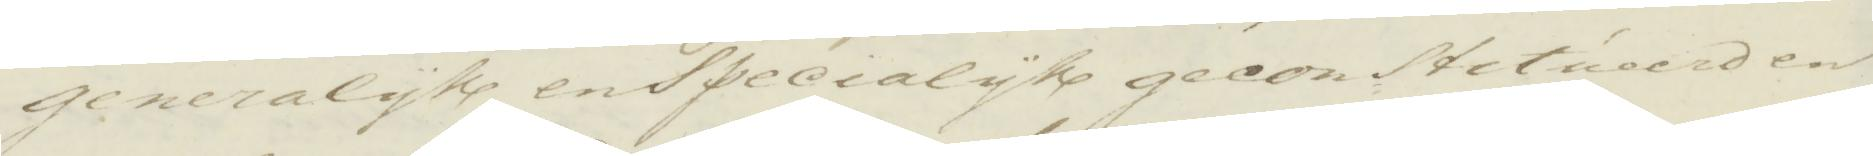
generalijk en specialijk gecon stitueerd en
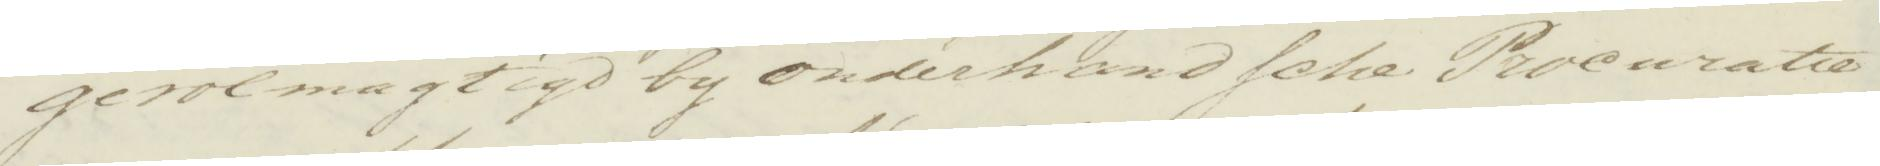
gevolmagtigd by onderhandsche Procuratie
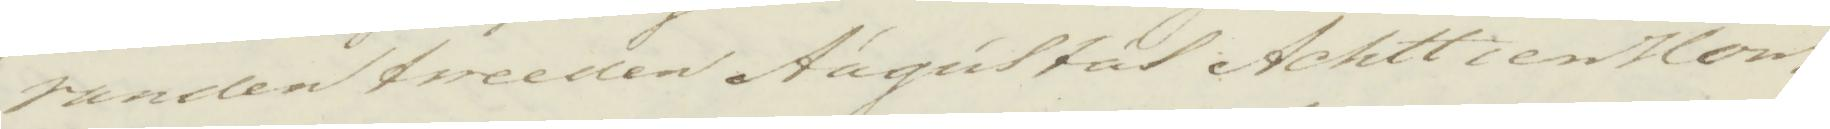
van den tweeden Augustus Achttien Hon„
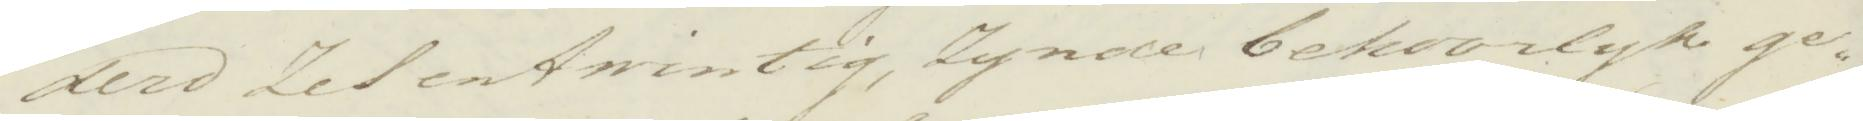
derd Zes en twintig, zynde behoorlyk ge„
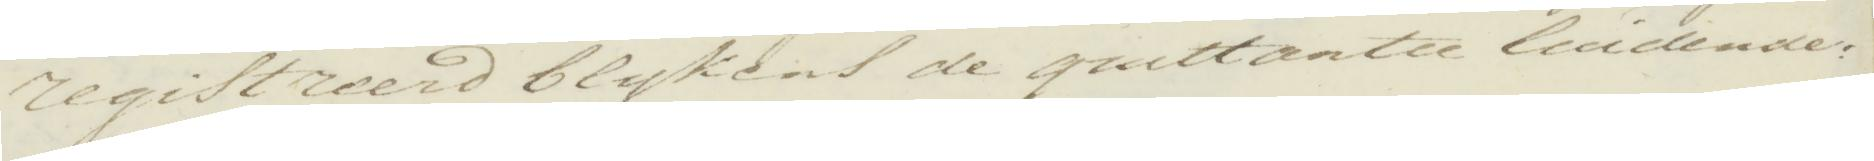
registreerd blykens de quittantie luidende.
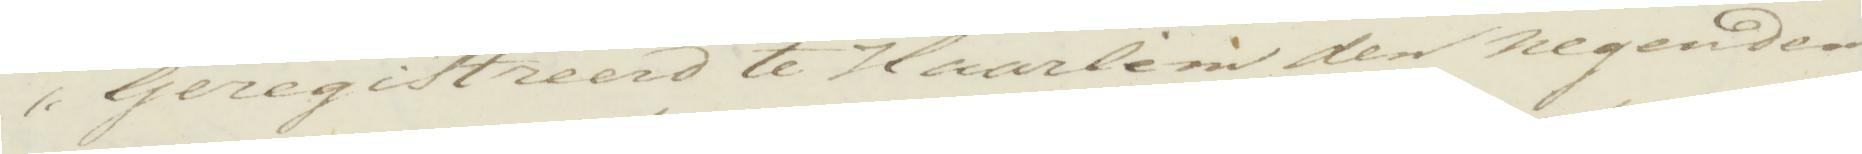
„ Geregistreerd te Haarlem den negenden
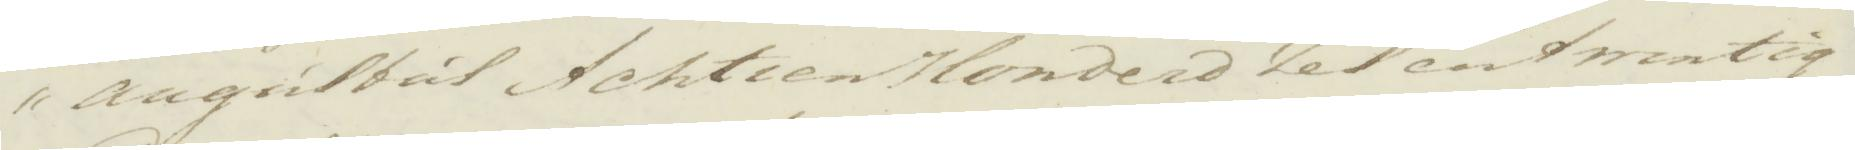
„ augustus Achtien Honderd Zes en twintig
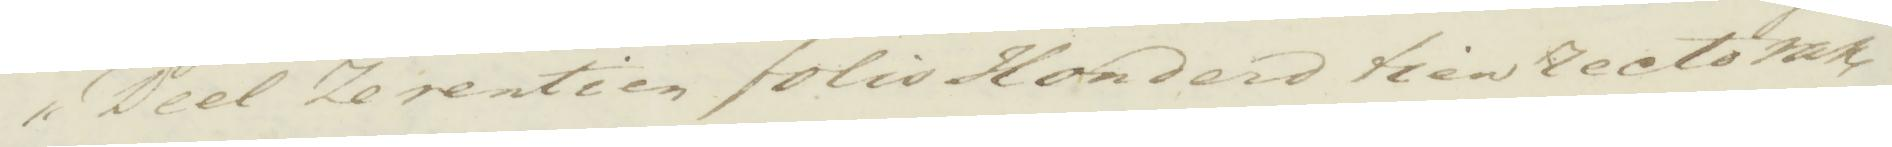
„ Deel Zeventien folio Honderd tien recto vak
